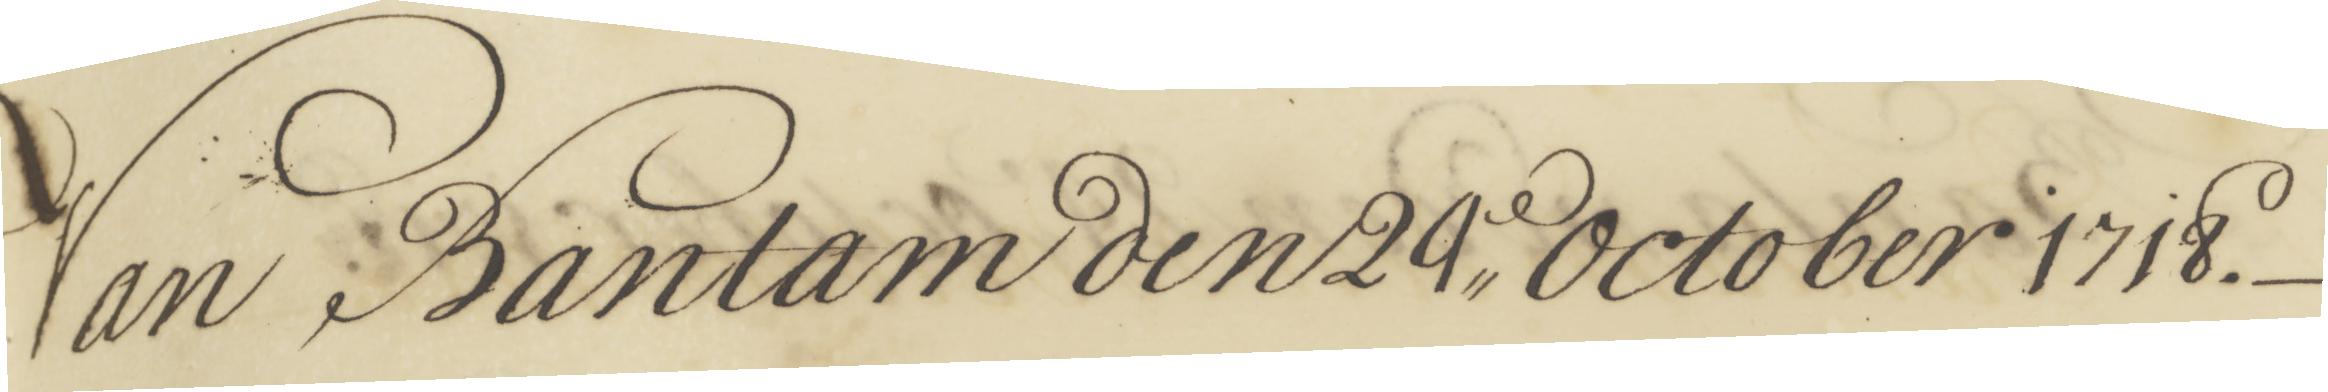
Van Bantam den 24„e October 1718._
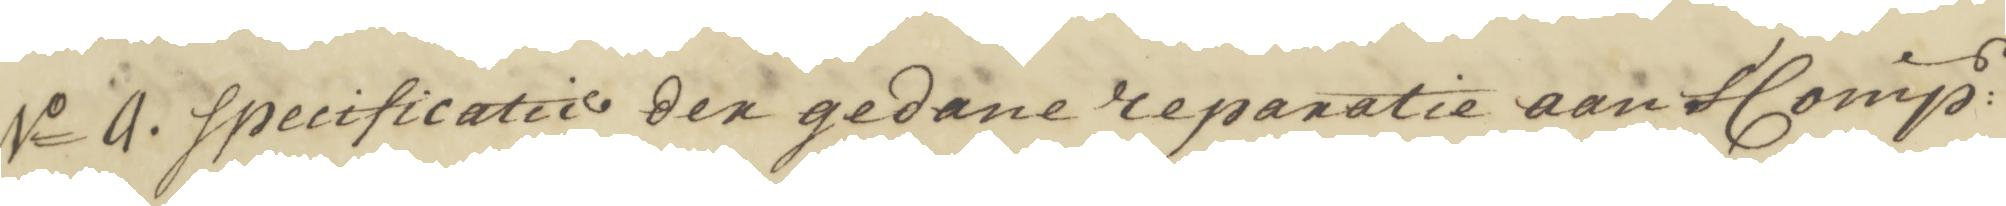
N=o 4. specificatie der gedane reparatie aan s' Comp:s
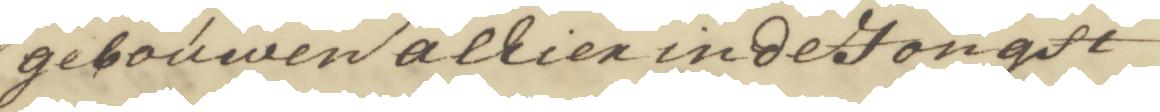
gebouwen alhier in de Iongst
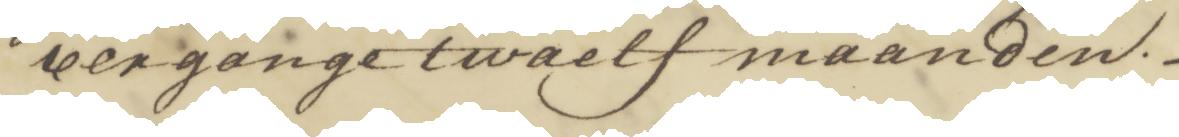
vergange twaelf maanden.-
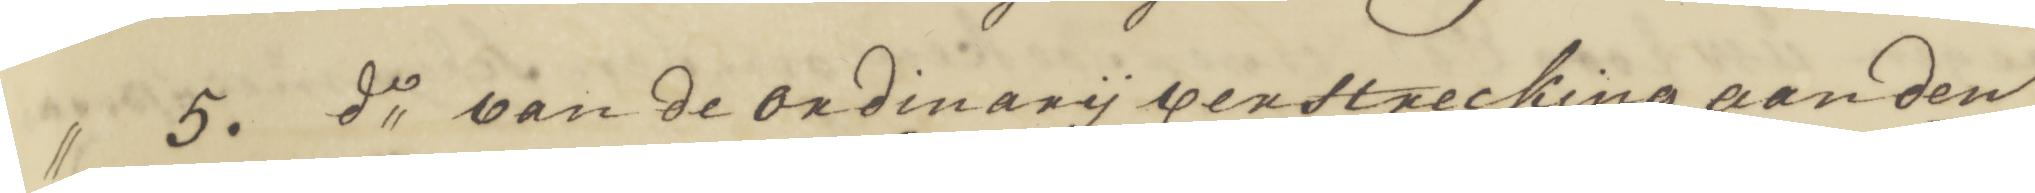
„ 5. d„o van de ordinarij verstrecking aan den
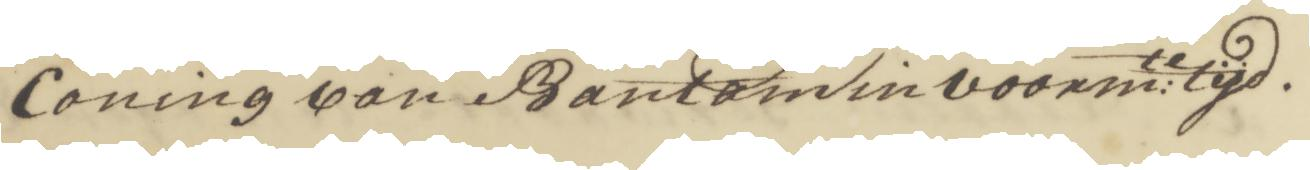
Coning van Bantam in voorm:te tijd.
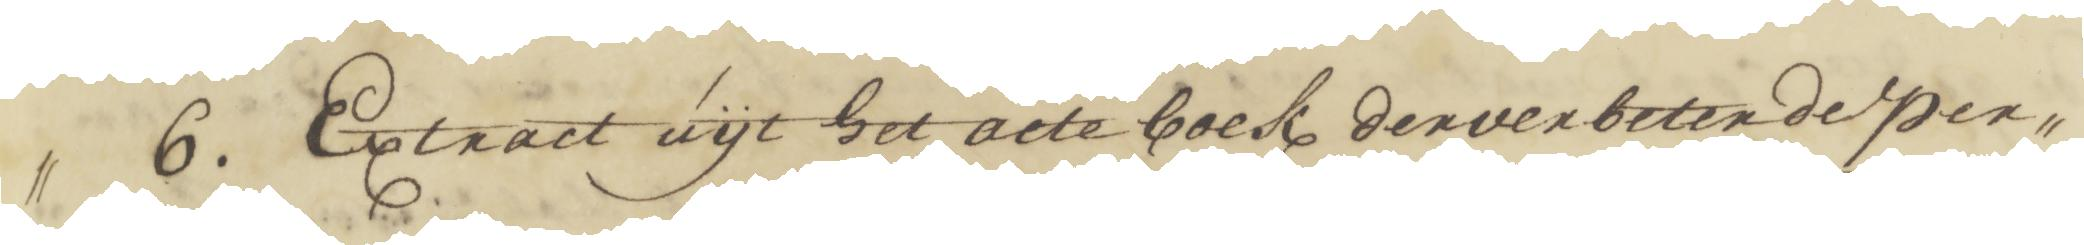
„ 6. Extract uijt het acte boek der verbeter de per„
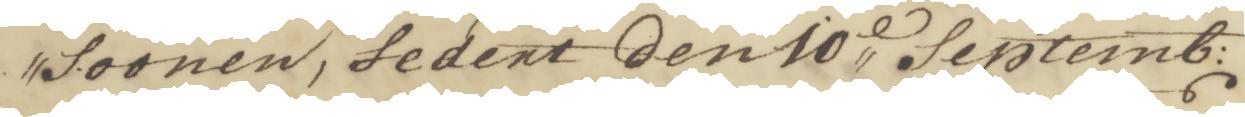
„Soonen, Sedert den 10„e Septemb:
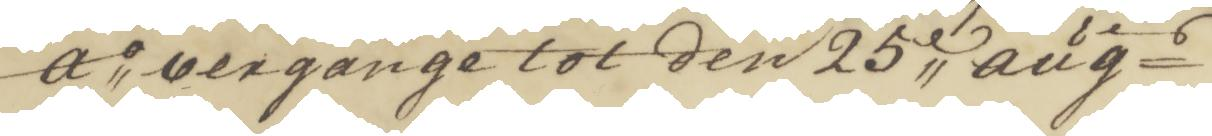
a„o vergange tot den 25„e aug=s
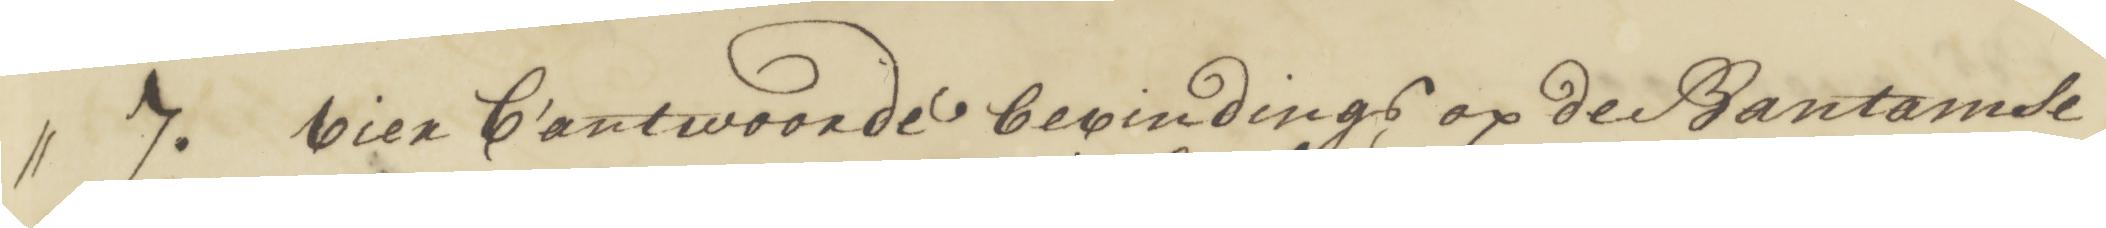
„ 7. vier b'antwoorde bevindings op de Bantamse
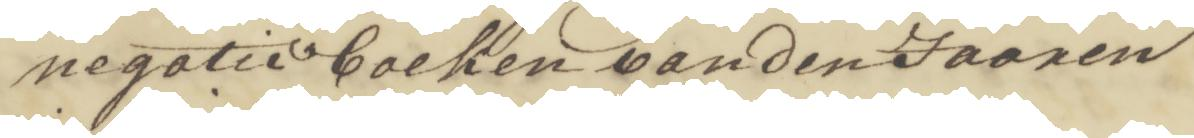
negotie boeken van den Iaaren
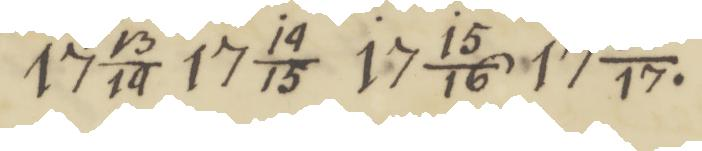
17 13/14 17 14/15 17 15/16 17 16/17.
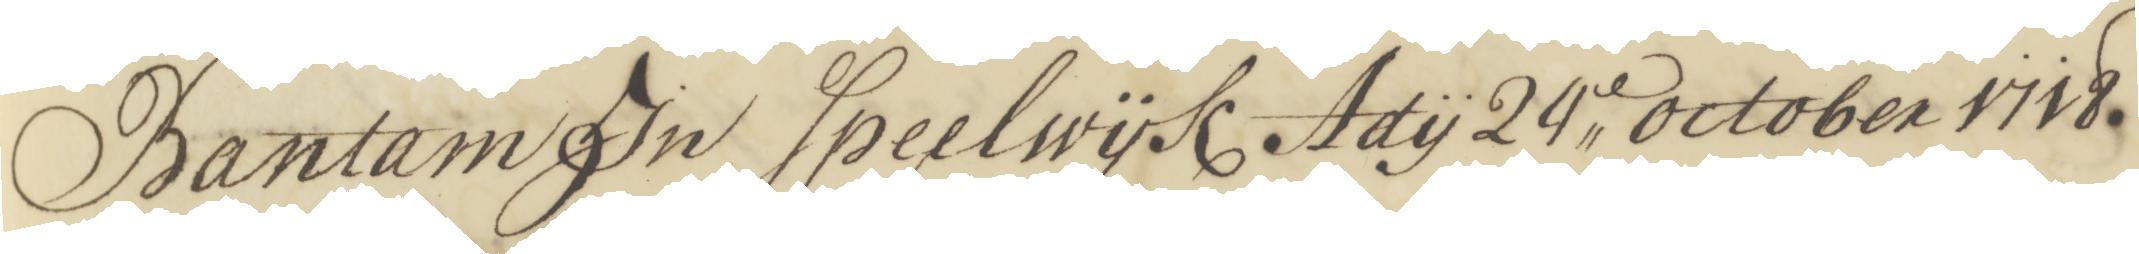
Bantam In Speelwijk Adij 24„e october 1718.
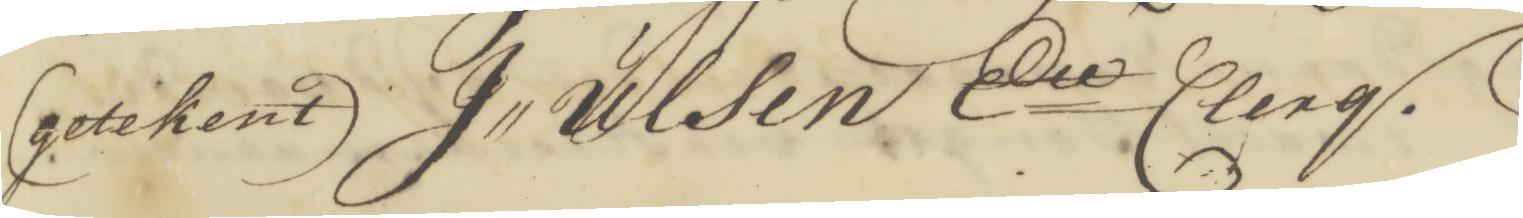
(getekent) J„ ulsen E=e Clerq.
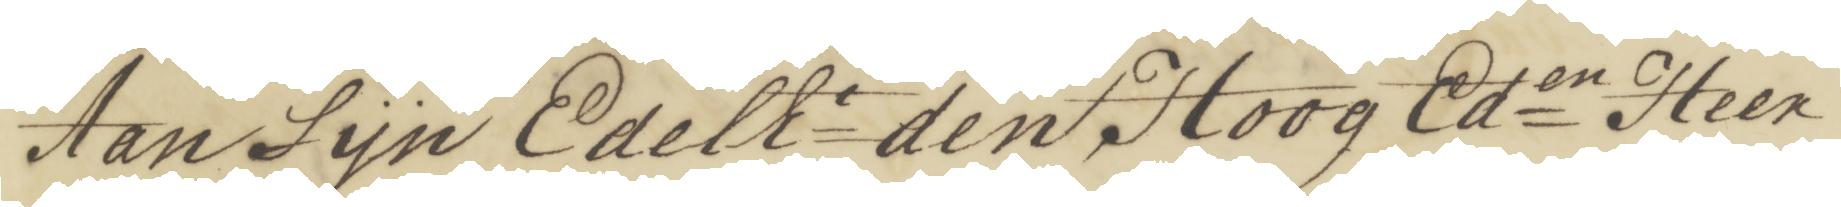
Aan Sijn Edelh=t den Hoog Ed=en Heer
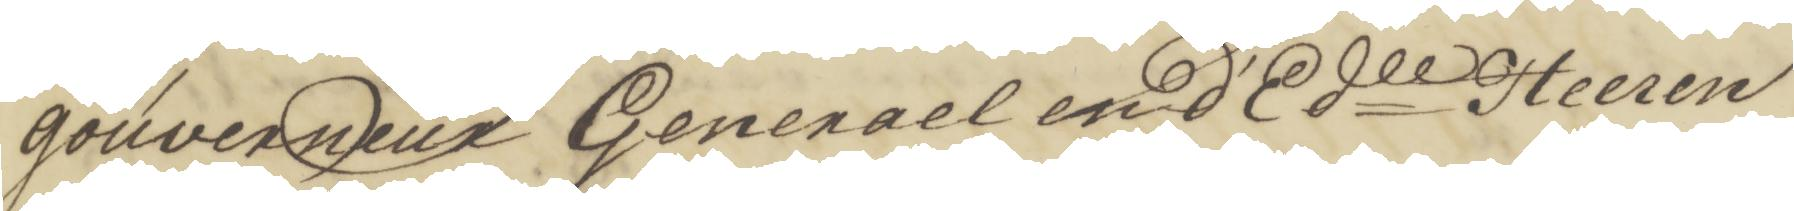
gouverneur Generael en d’ Ed=le Heeren
